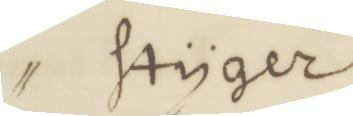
„ stijger
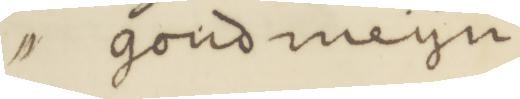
„ goudmeijn
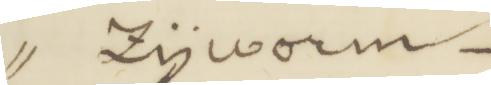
„ zijworm
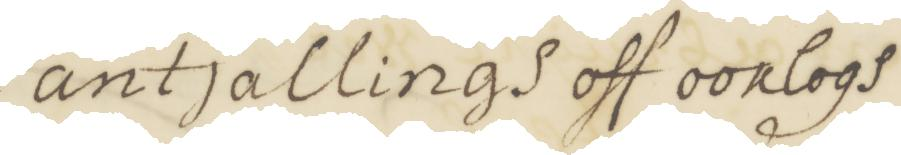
Pantjallings off oorlogs
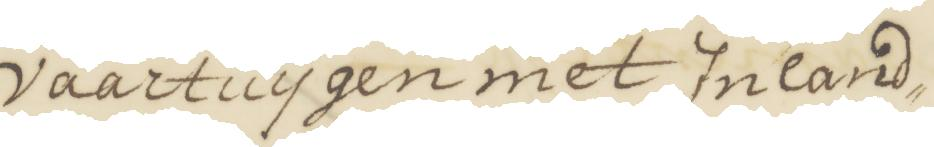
vaartuijgen met Jnland„
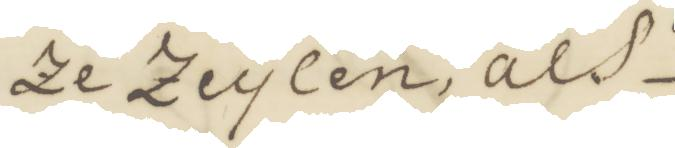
,,ze zeijlen, als
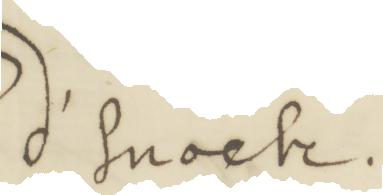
d’ snoek.
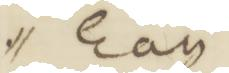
„ haij
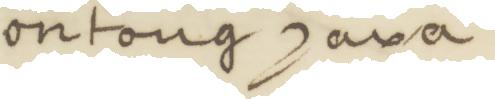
ontong java
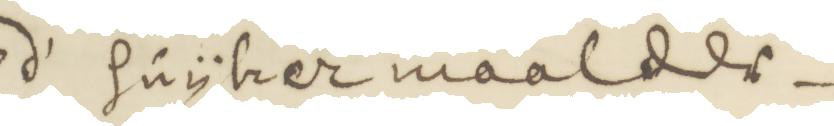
d’ suijker maalder
